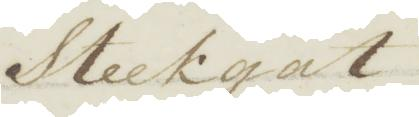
steekgat
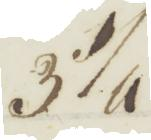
3 1/4
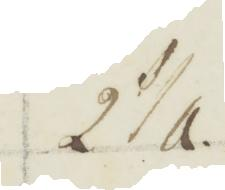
2 1/4.
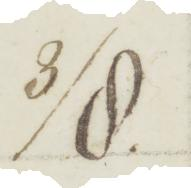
3/8.
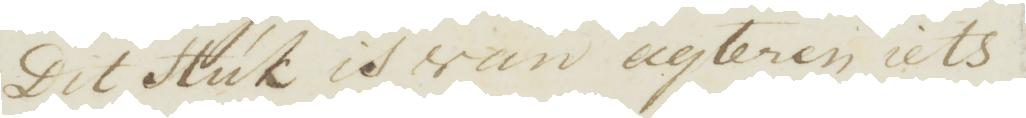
Dit stuk is van agteren iets
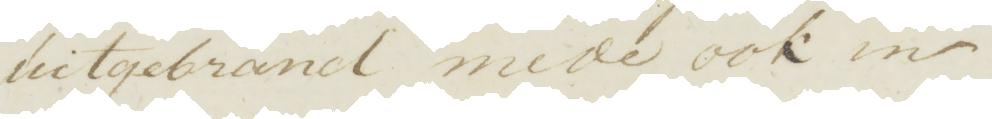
uitgebrand mede ook in
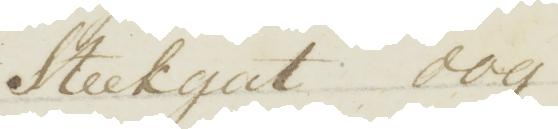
Steekgat dog
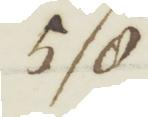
5 7/8
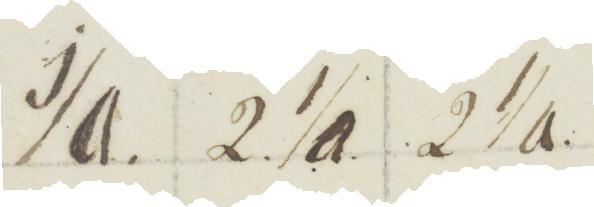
1/4. 2 1/4. 2 ¼.
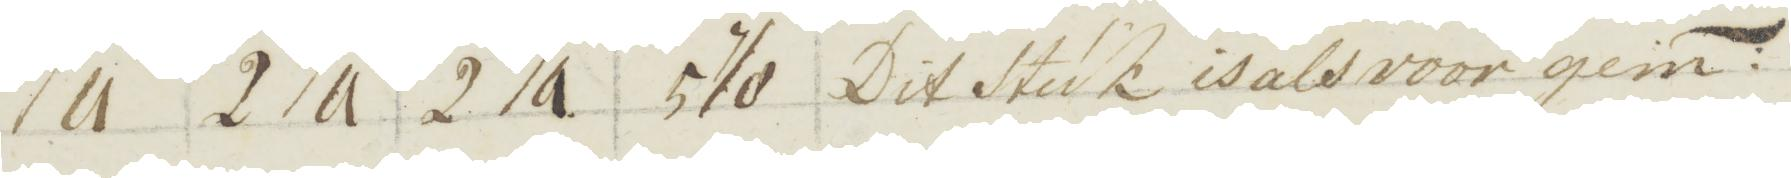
1/4 2 1/4 2 1/4 5 7/8 Dit stuk is als voor gem:
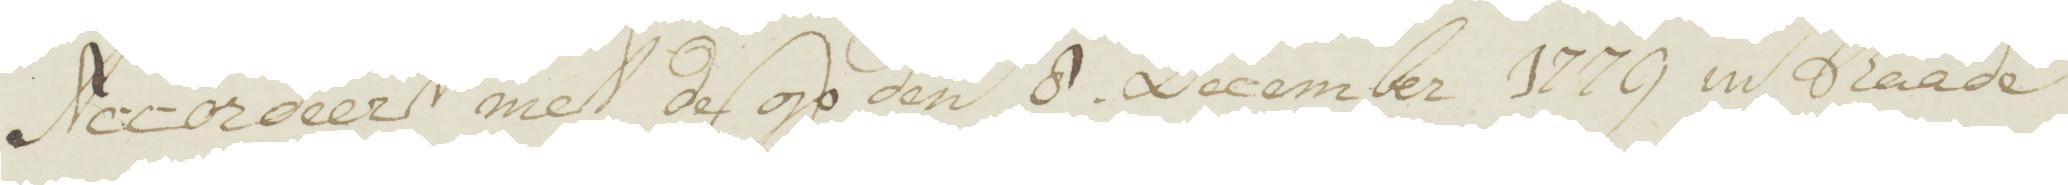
Accordeert met de op den 8. December 1779 in Raade
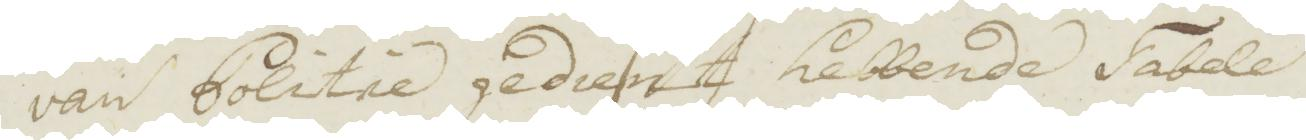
van Politie gedient hebbende Tabele
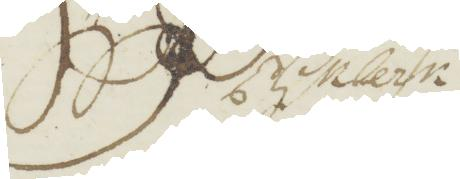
G klerk
